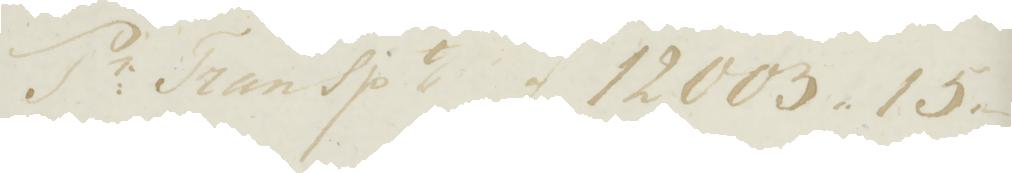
Pr Transp„t ƒ 12003„ 15„
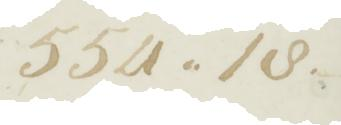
554„ 18„
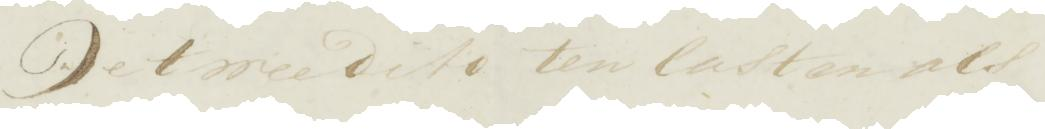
De twee dito ten lasten als
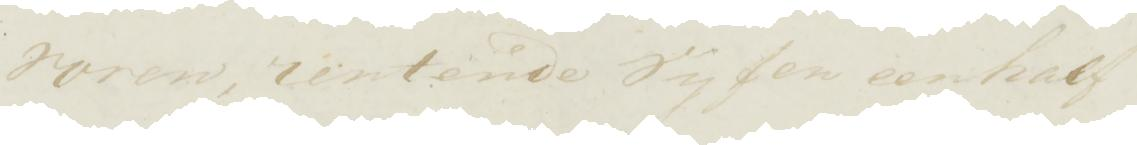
voren, rentende Vyf en een half
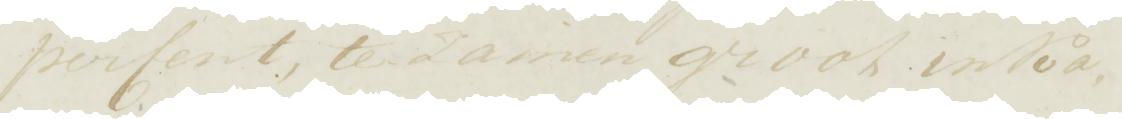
percent, te zamen groot in Ka„
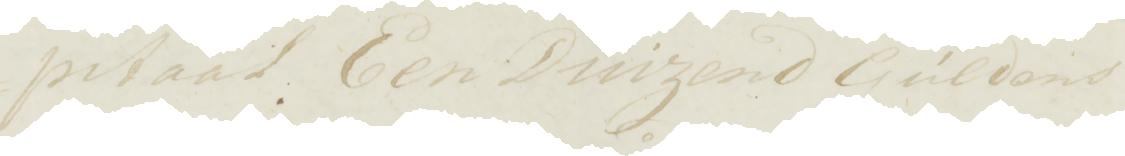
pitaal, Een Duizend Guldens
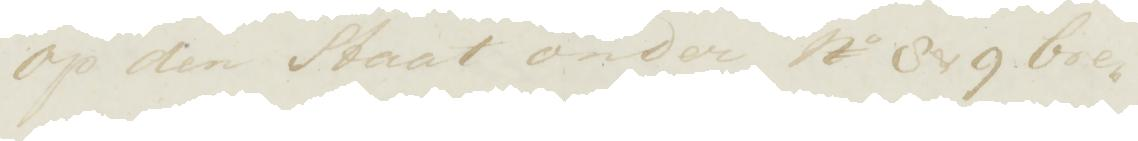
op den staat onder No 849 bre„
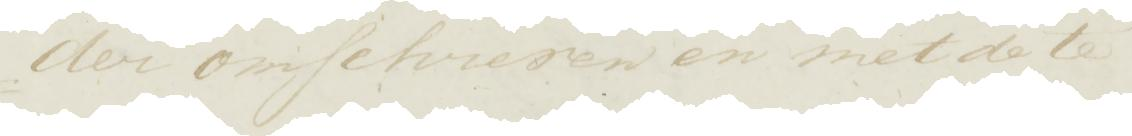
=der omschreven en met de te
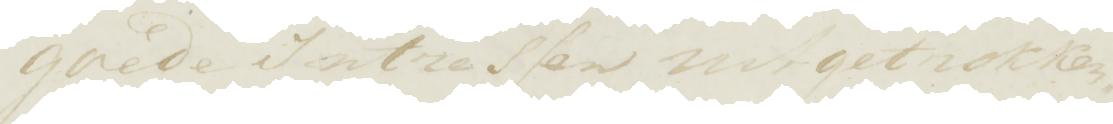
goede Intressen uitgetrokken
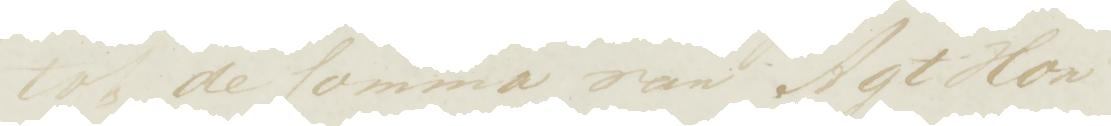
tot de somma van Agt Hon
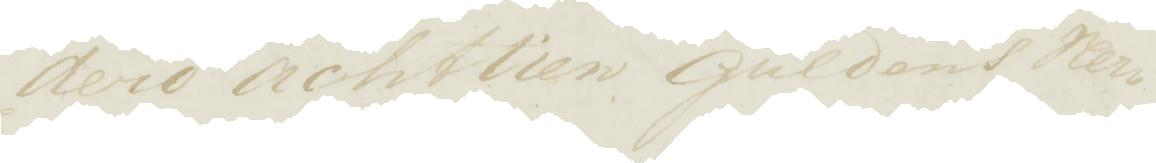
derd achttien guldens Veer
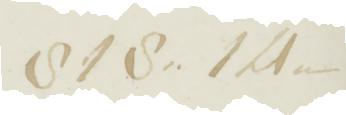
818„ 14
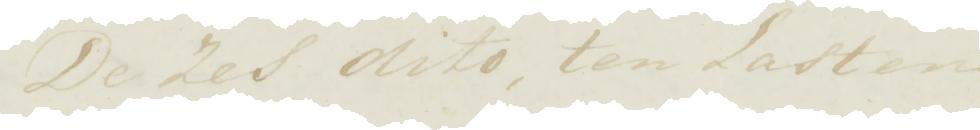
De Zes dito, ten lasten
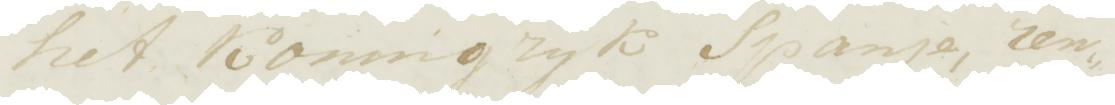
het Koningryk spanje, ren„
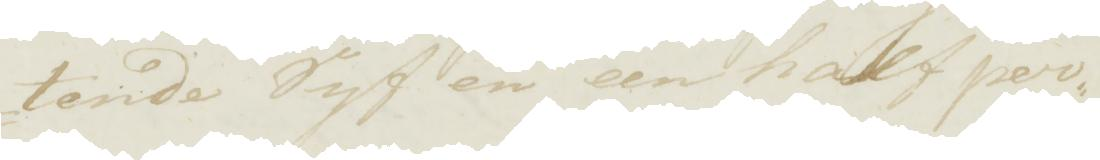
=tende Vyf en een half per„
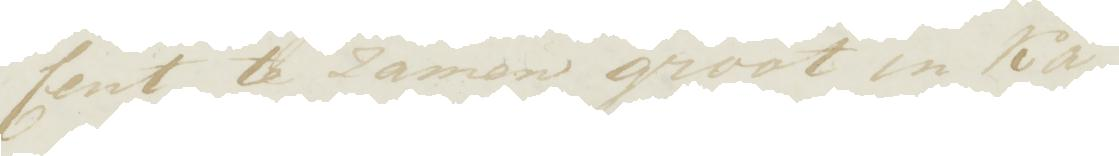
cent, te zamen groot in Ka
